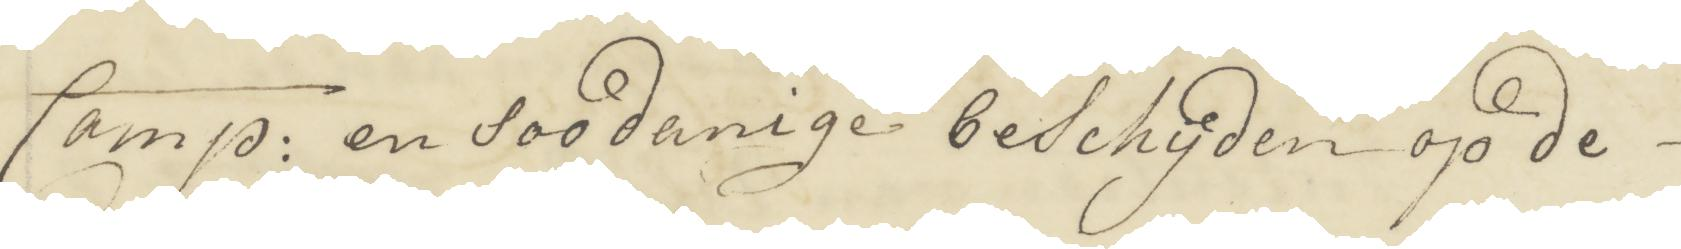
Comp: en soodanige beschijden op de
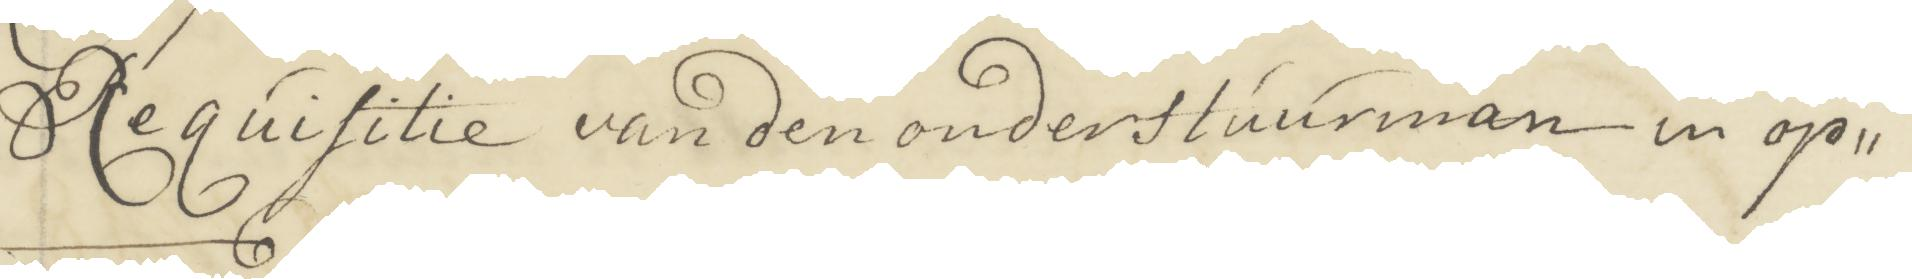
Requisitie van den onderstuurman in op„
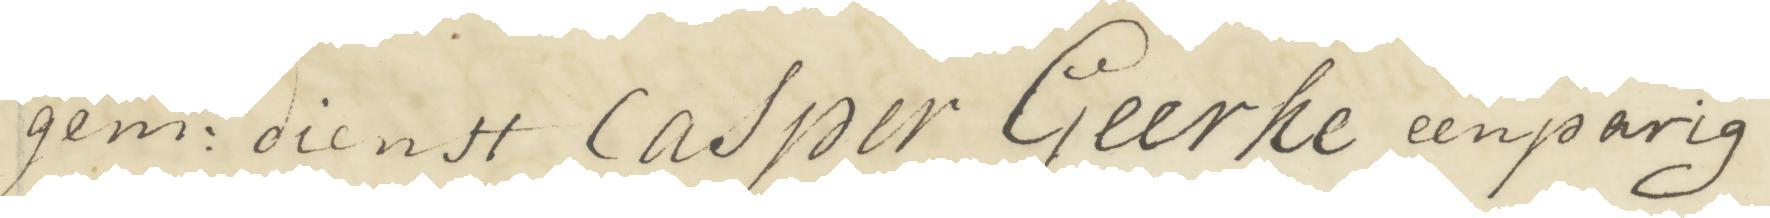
gem: dienst Casper Geerke een parig
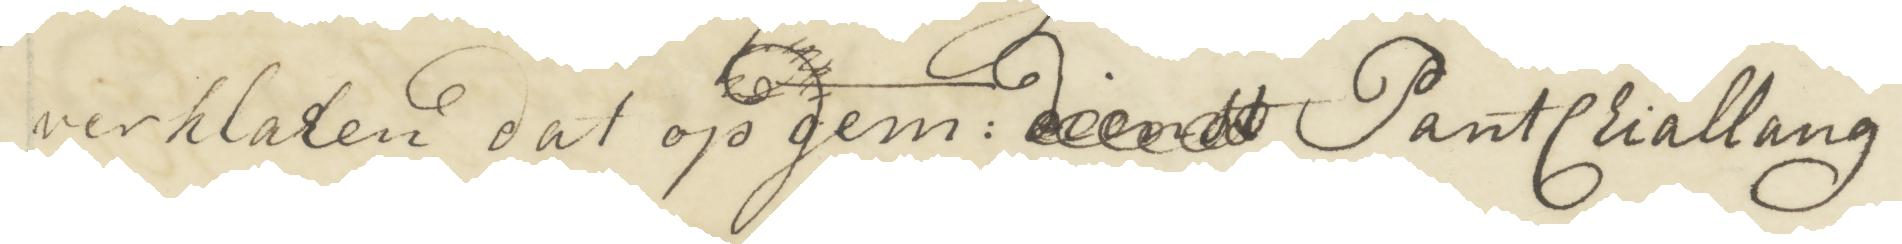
verklaren dat op gem: dienst Pantchiallang
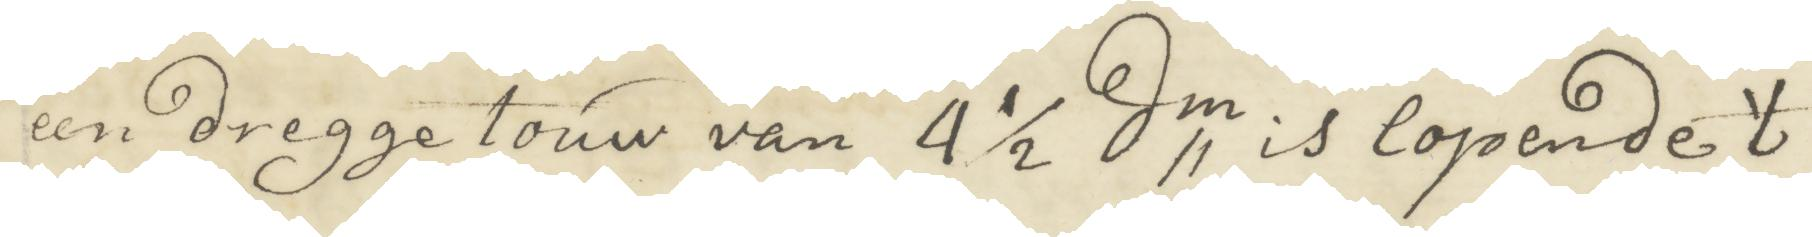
een dregge touw van 4½ d„m is lopende 't
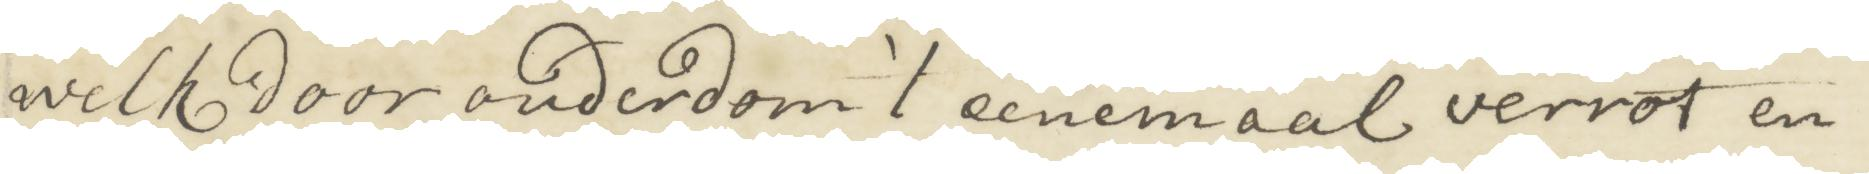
welk door ouderdom ’t eenemaal verrot en
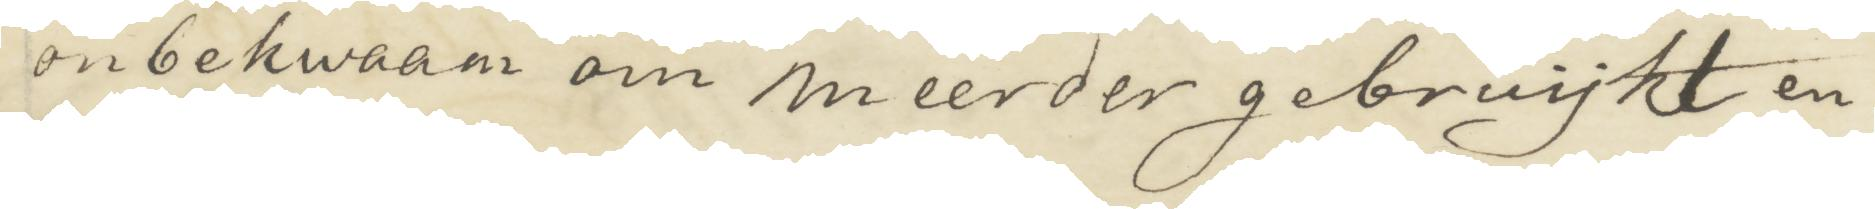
onbekwaam om meerder gebruijkt en
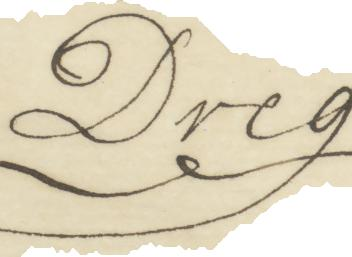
Dreg
